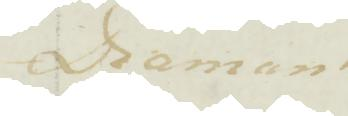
Diamant
